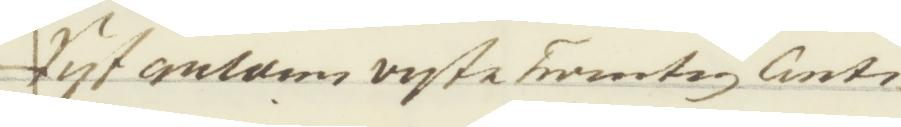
Vyf guldens vyf & Twintig Cents
